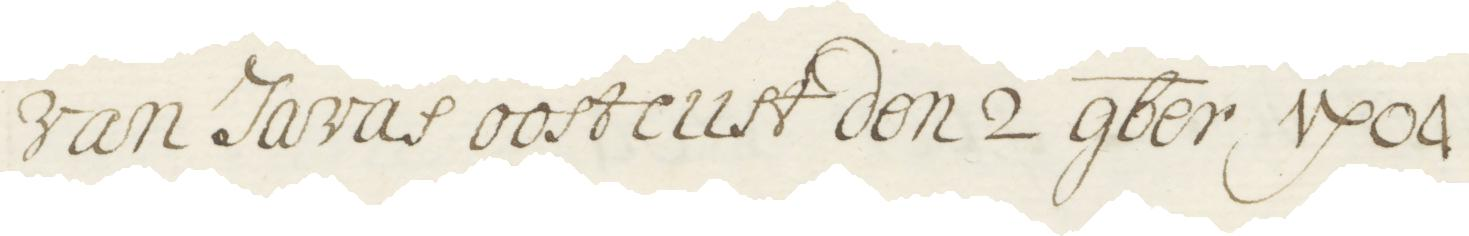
van Iavas oostcust den 2 9ber 1704
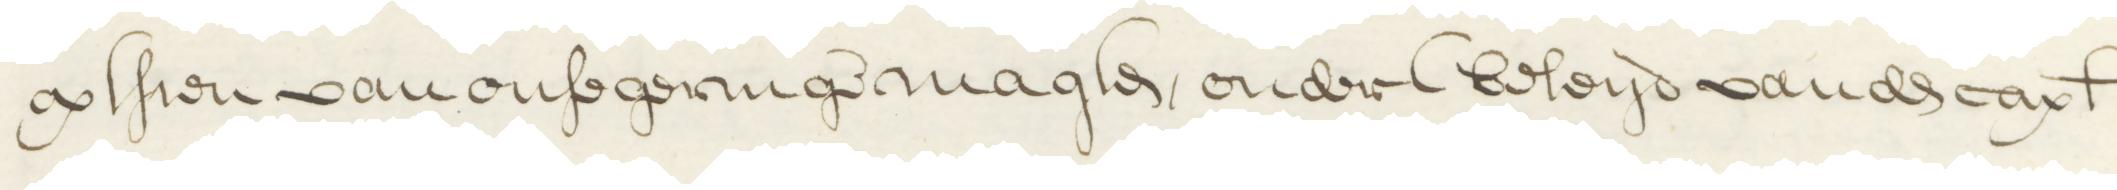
op t sien van onse geringe magten, onder t beleyd van den capt
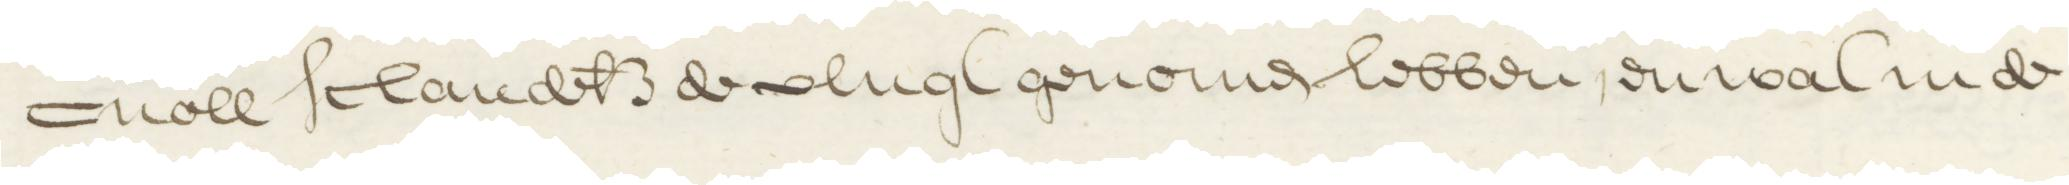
cnoll schandelijk de vlugt genomen hebben, en wat in de
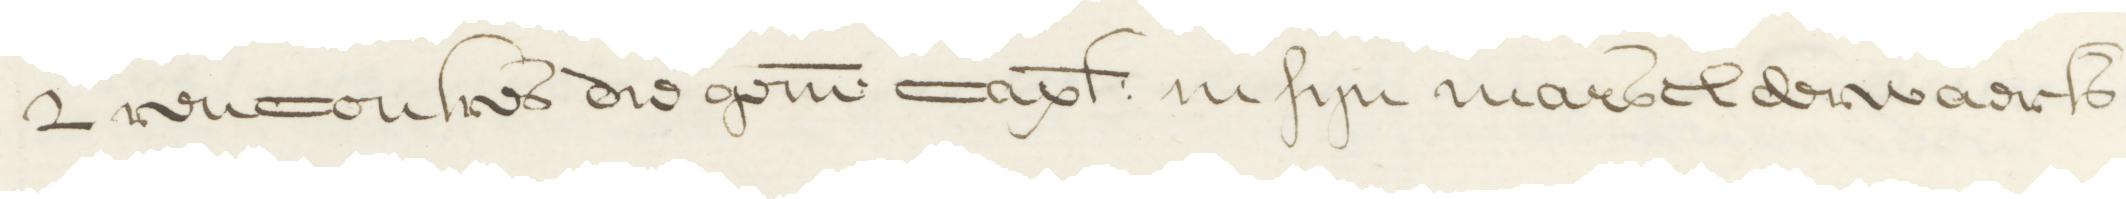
2 rencontres die gem capt: in syn marsch derwaerts
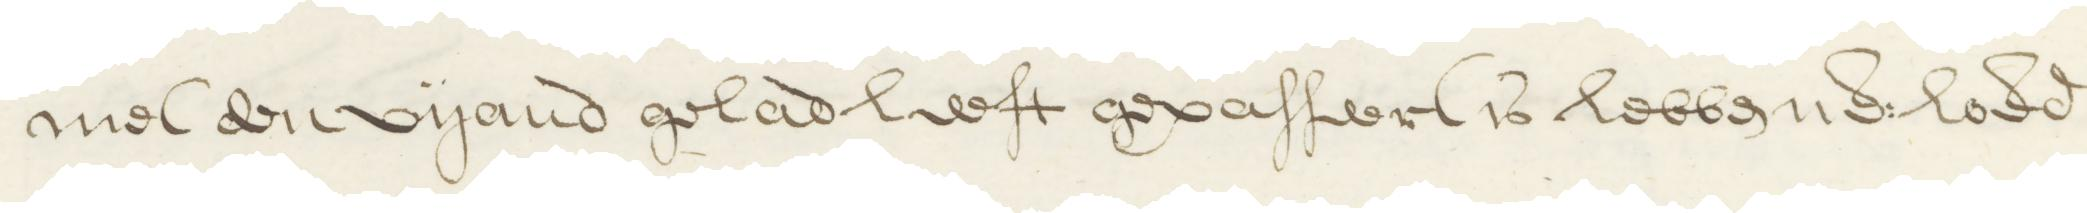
met den vijand gehad heeft gepasseert is hebben uE: ho Ede
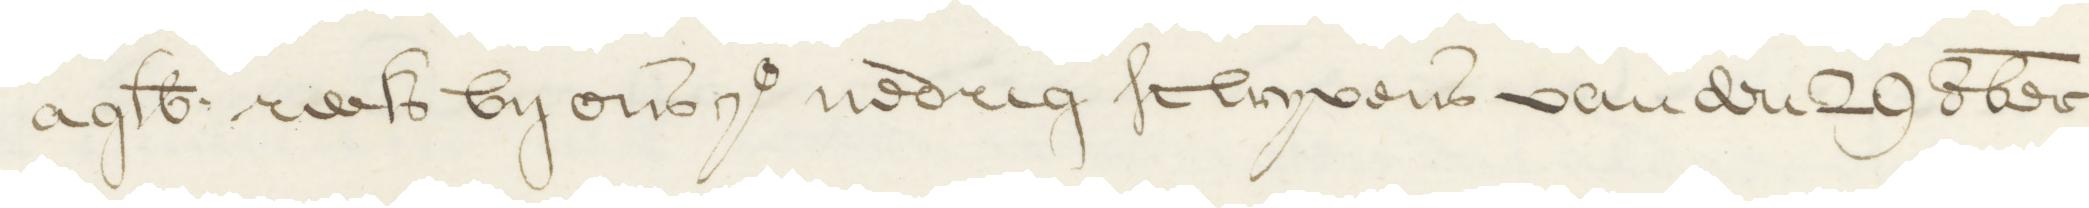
agtb: reets by ons jo nedrig schryvens van den 29 8ber
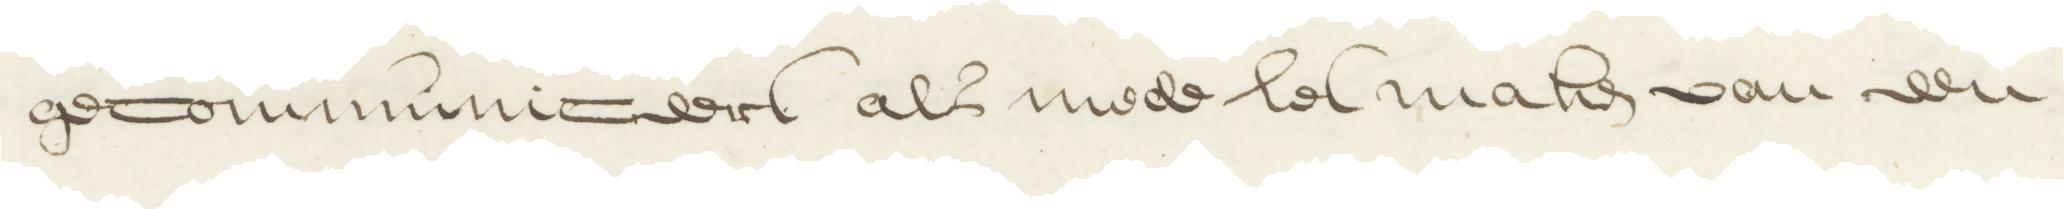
gecommuniceert als mede het maken van een
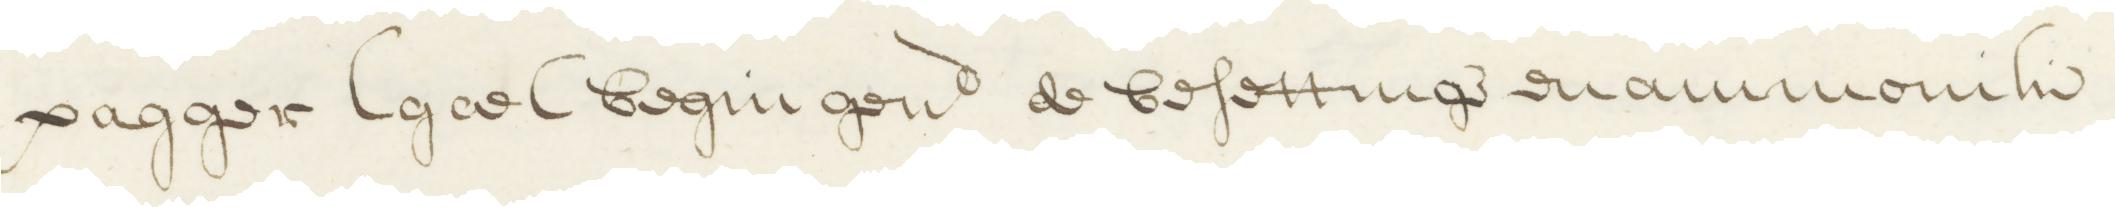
pagger 't goet begingend de besettinge en ammonitie
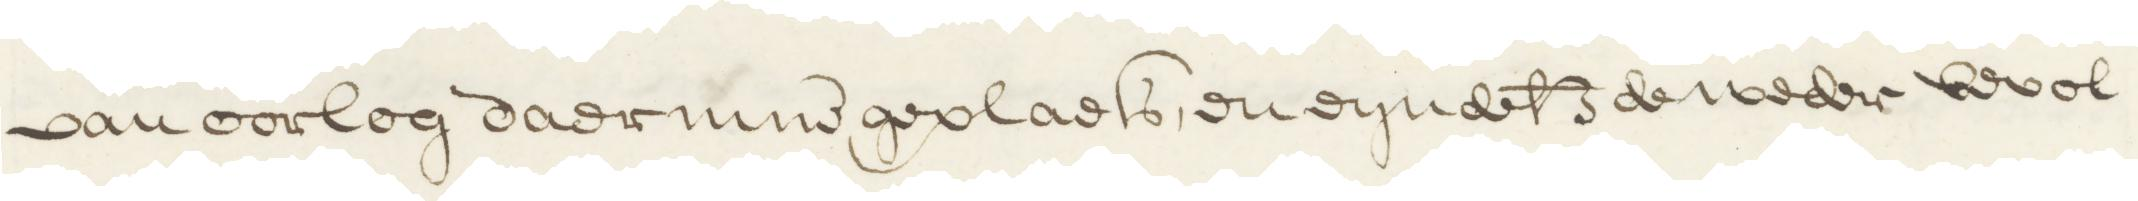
van oorlog daerinne geplaets, en eyndelijk de weder bevol
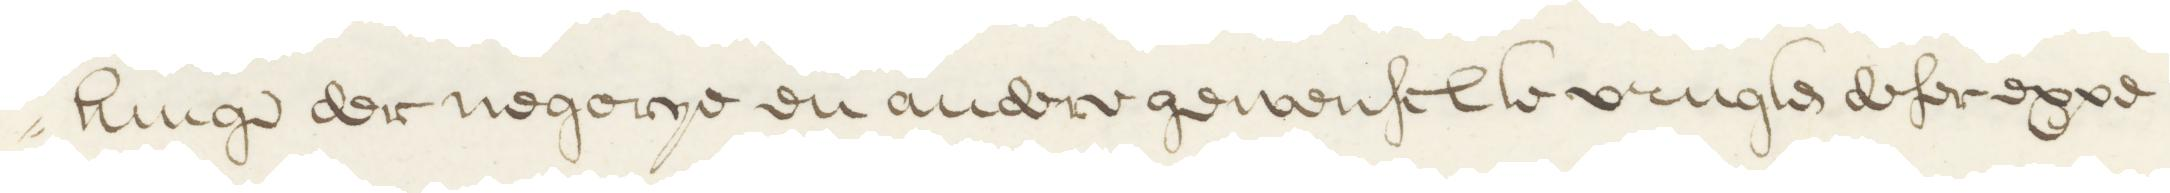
„kinge der negorye en andere gewenschte vrugten deser expe
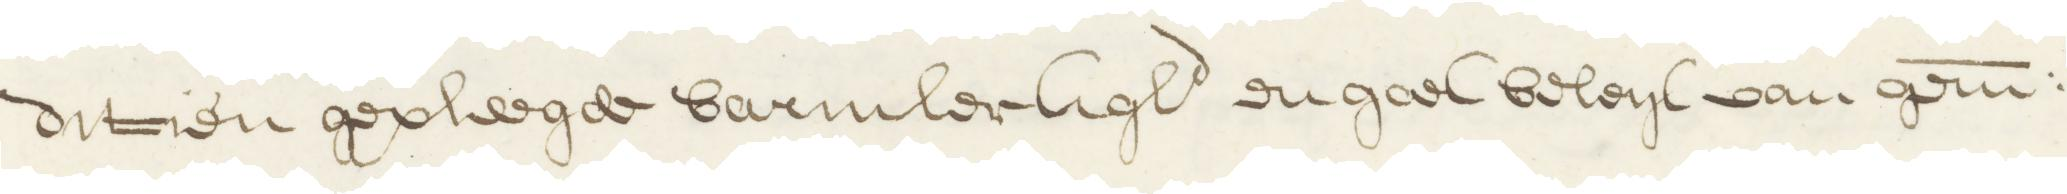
ditien gepleegde barmhertighd en goet beleyt van gem:
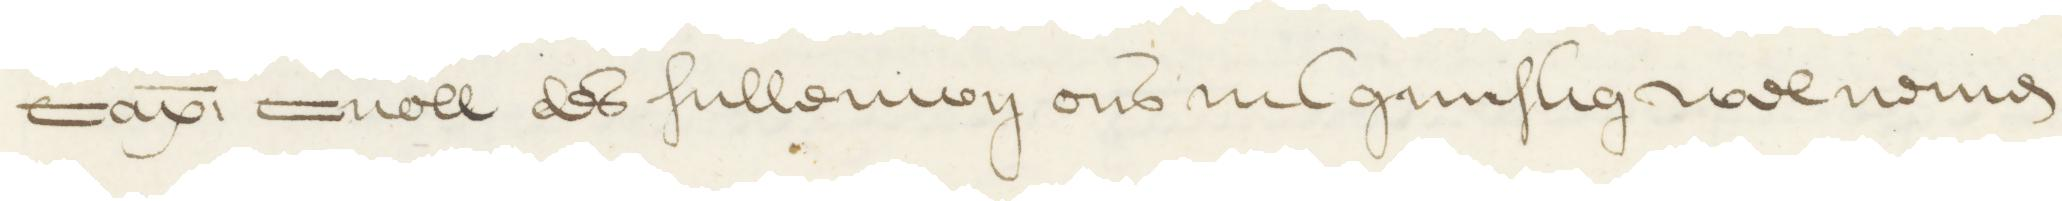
cap: cnoll des sullen wij ons in t gunstig wel nemen
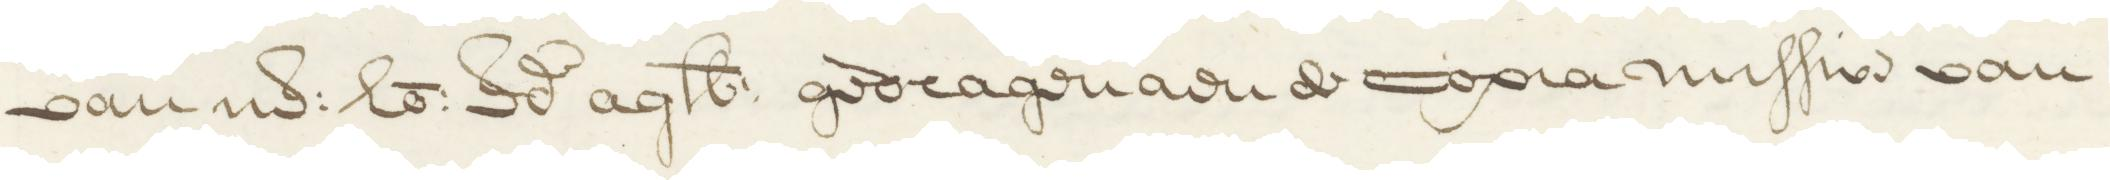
van uE: ho: Ede agtb: gedragen aen de copia missive van
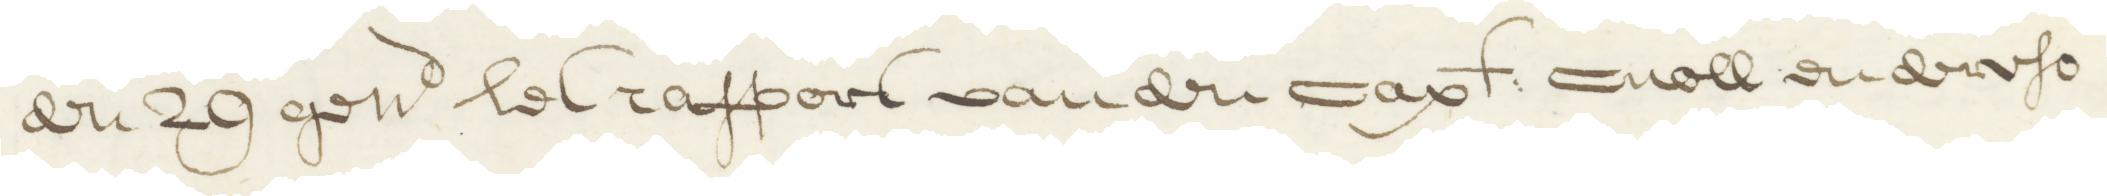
den 29 gend het rapport van den capt: cnoll en de reso
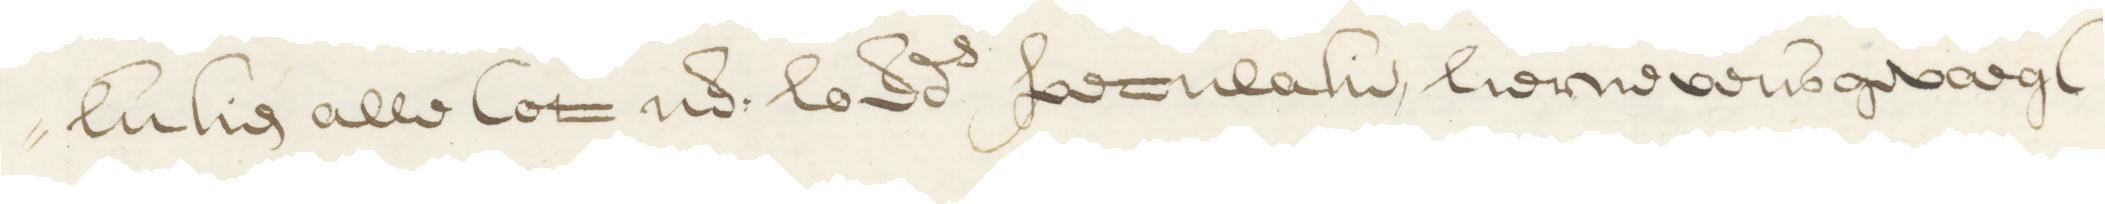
„lutie alle tot uE: ho Eden speculatie, hier nevens gevoegt
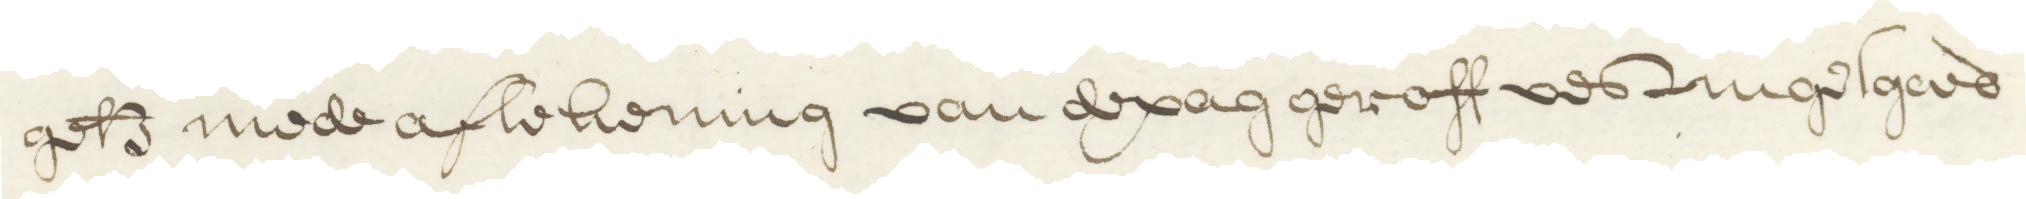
gelijk mede aftekening van de pagger off vestinge t goed
